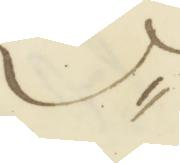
D„o
